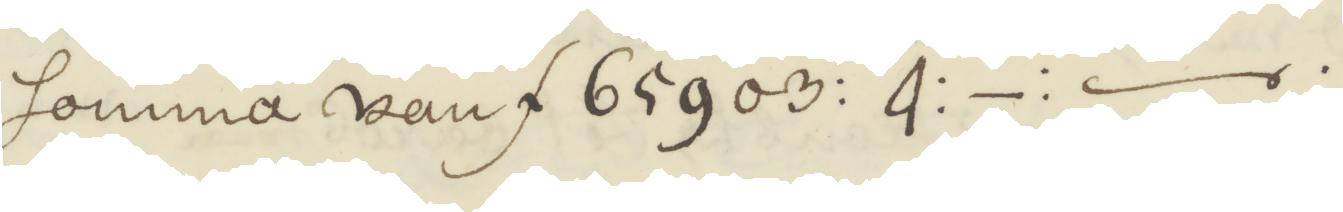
somma van ƒ65903:4:—:—.
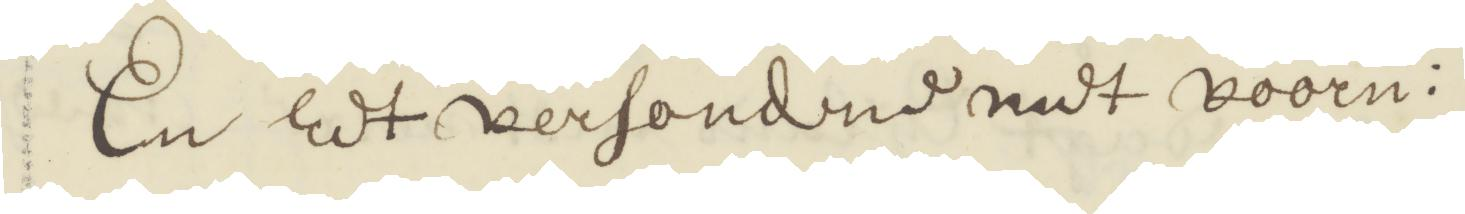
En het versondene met voorn:
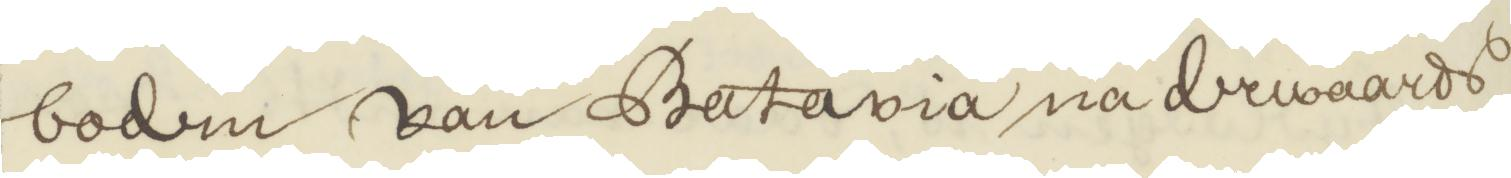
bodem van Batavia na derwaards
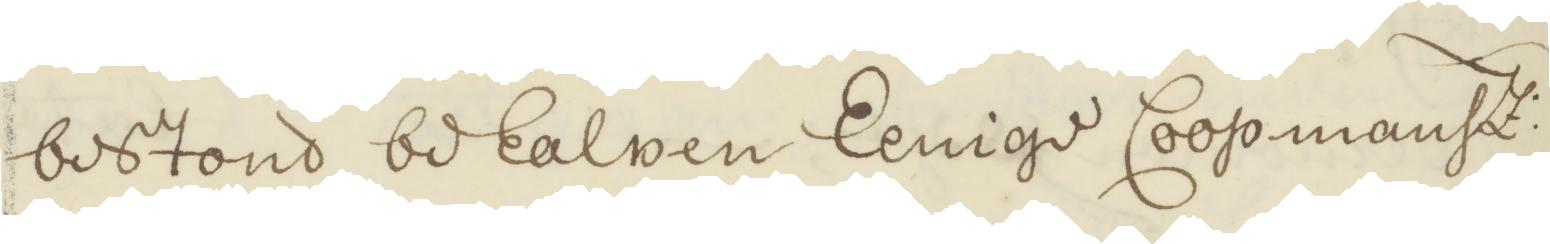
bestond behalven Eenige Coopmansz:
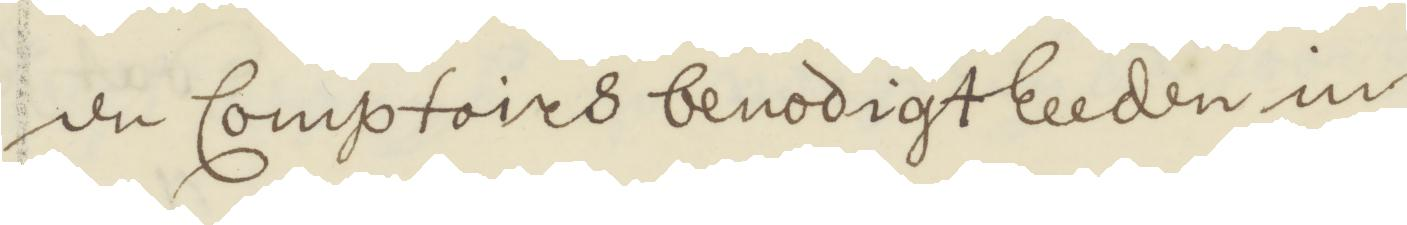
en Comptoirs benodigtheeden in
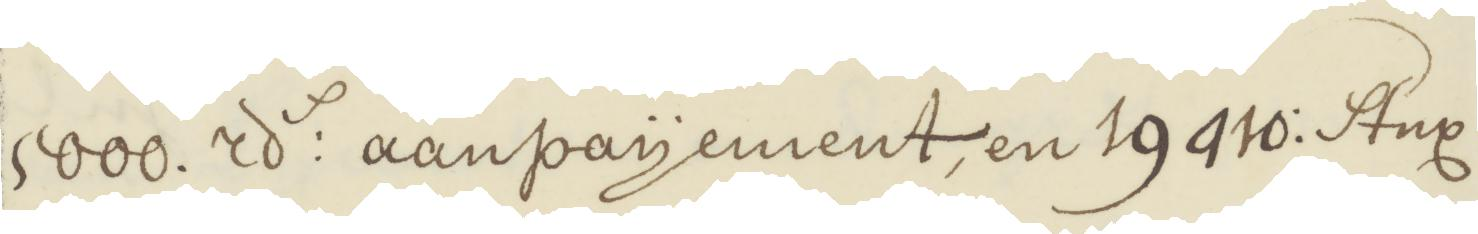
5000. rd:s aanpaijement, en 19410: stux
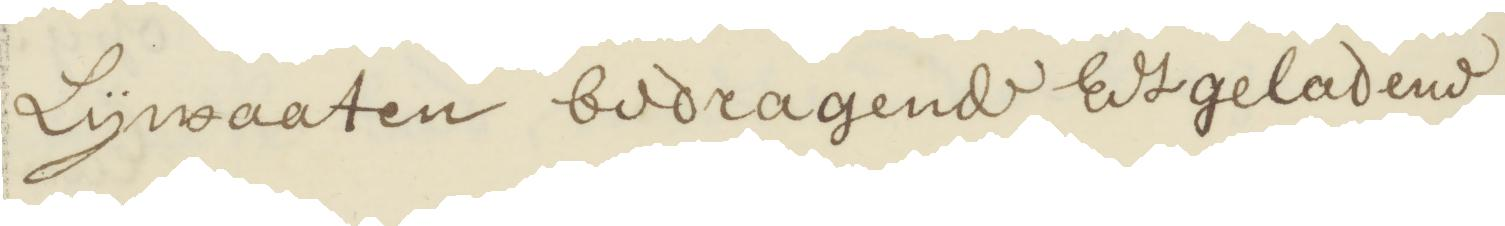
lijwaaten bedragende het geladene
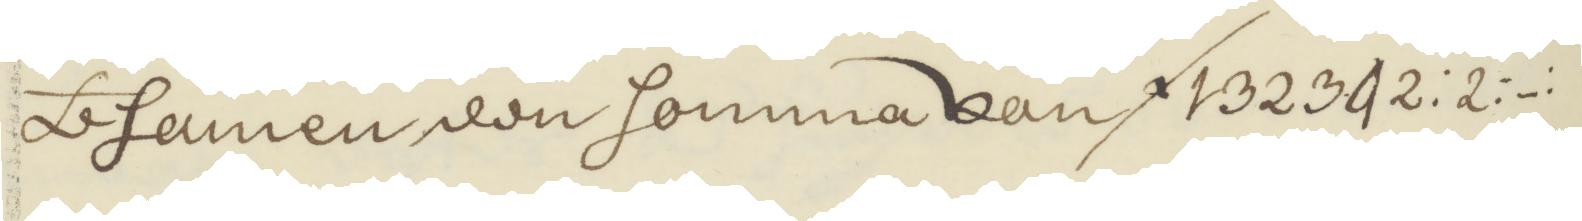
tesamen een somma van ƒ132342:2:-:
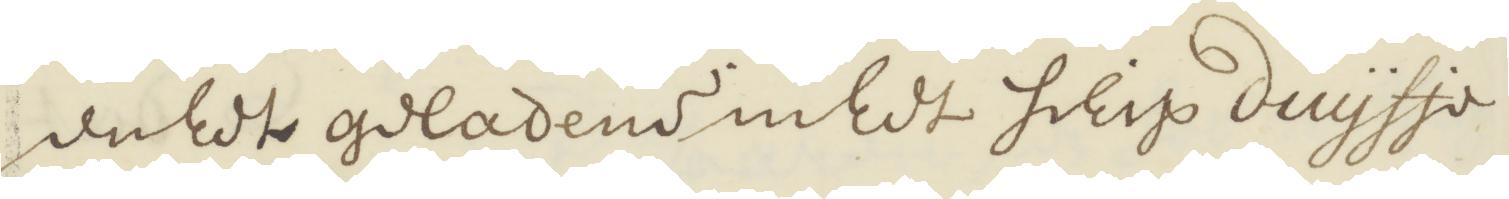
en het geladene in het schip duijfje
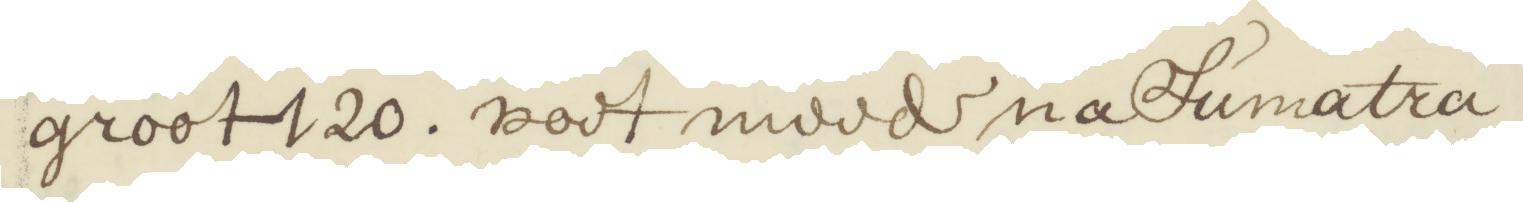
groot 120. voet meede na Sumatra
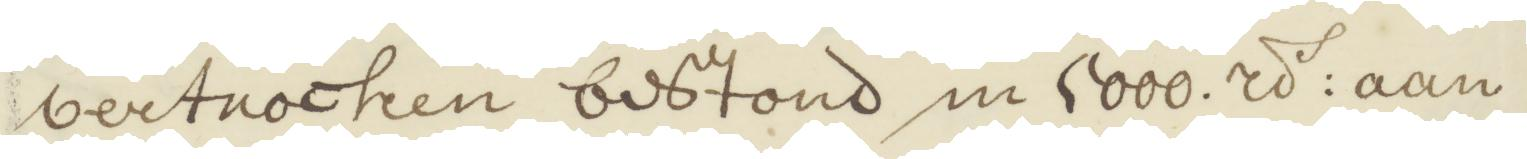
vertrocken bestond in 5000. rd:s aan
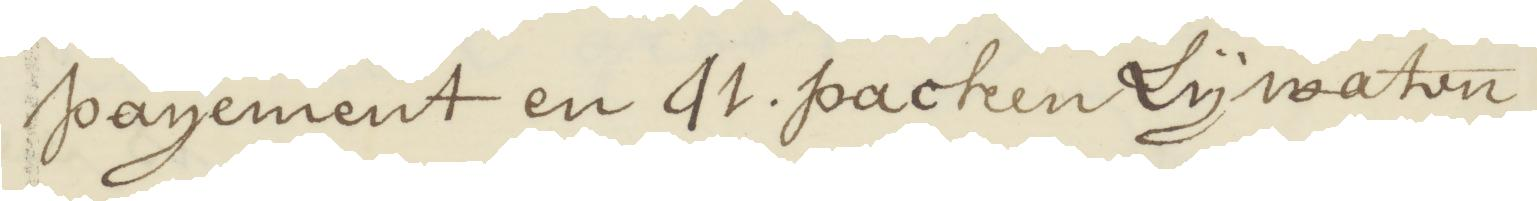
paijement en 41. packen lijwaten
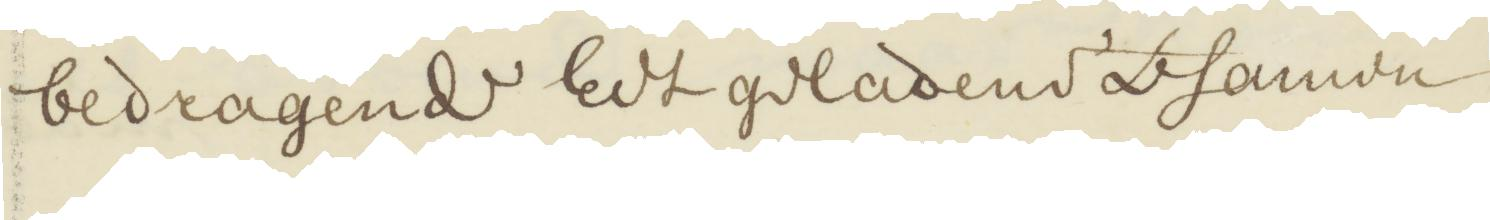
bedragende het geladene 'tesamen
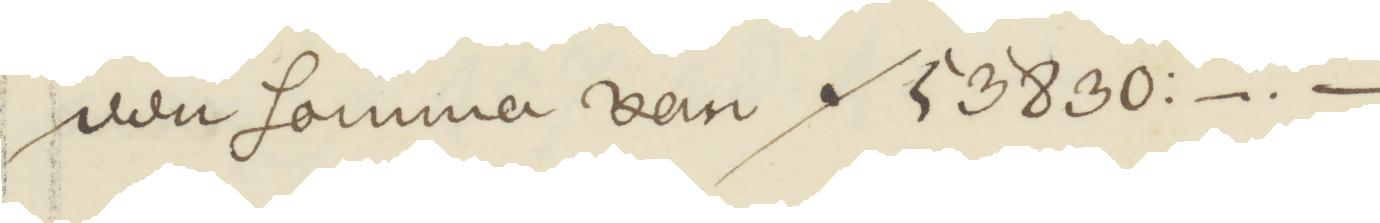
een somma van ƒ53830:—.—.
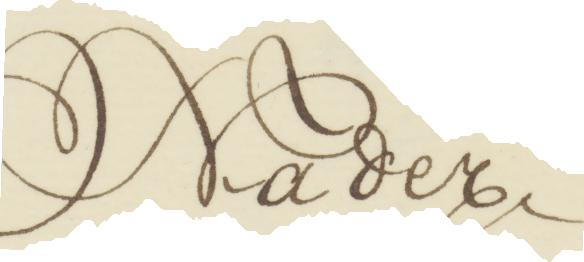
Nader
